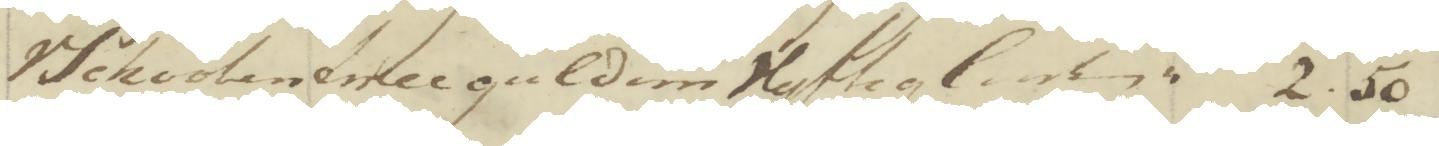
V Schooten twee guldens Vyftig Cents „ 2.50
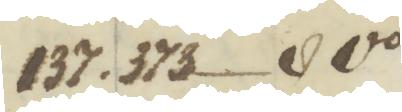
137. 373 8 d
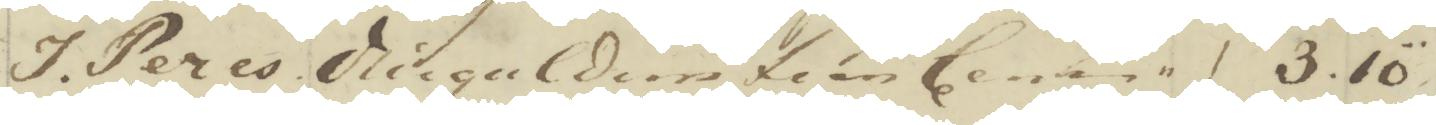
J. Peres. drie guldens tien Cents „ 3.10
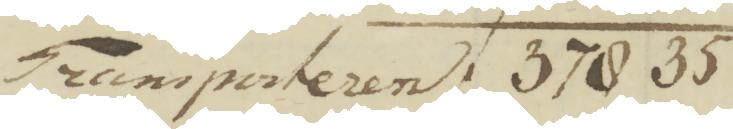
Transporteren ƒ 378 35
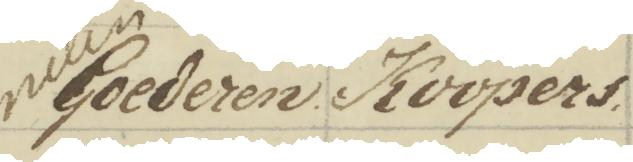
Goederen. Koopers.
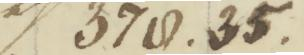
ƒ 378. 35.
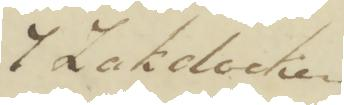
7 Zakdoeken
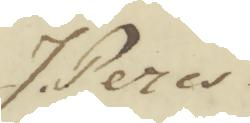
J. Peres
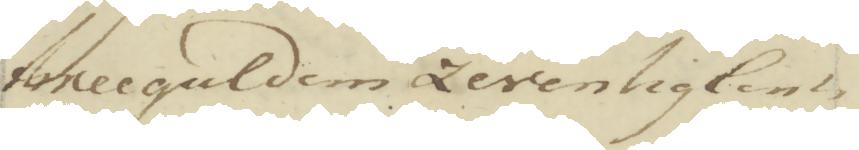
twee guldens zeventig Cents
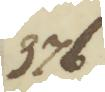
376
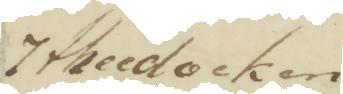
7 theedoeken
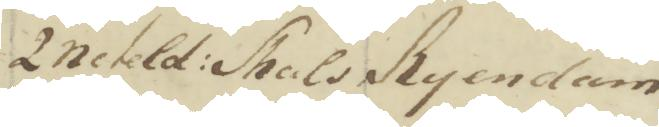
2 neteld: Shals . Ryendam
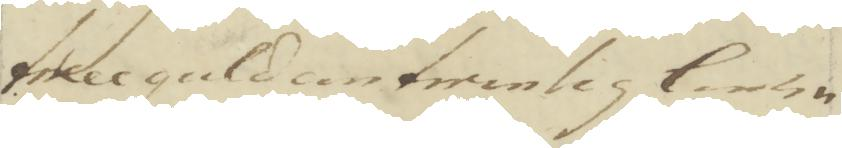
Twee guldens twintig Cents
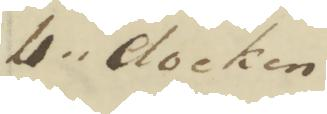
4 „ doeken
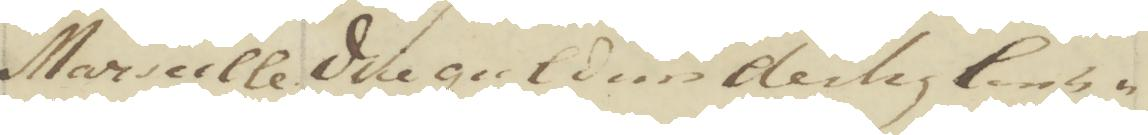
Marseille drie guldens dertig Cents „
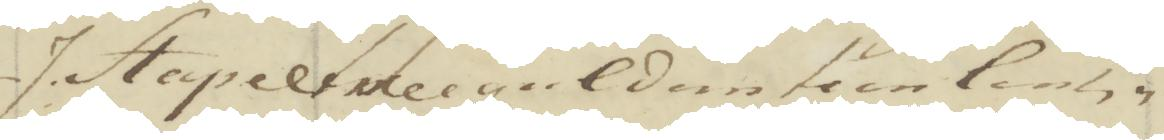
J. stapel twee gulden tien Cents „
